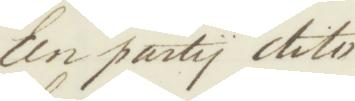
Een partij dito
